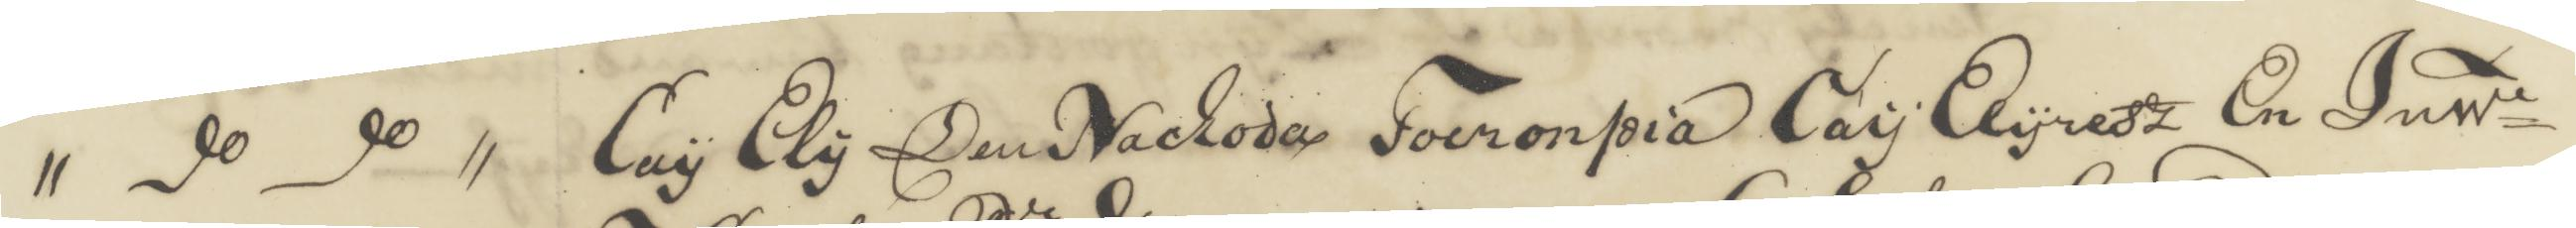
„ _o _o „ Caij Elij Den Nachoda Toeronpia Caij Elijest En Inw=r
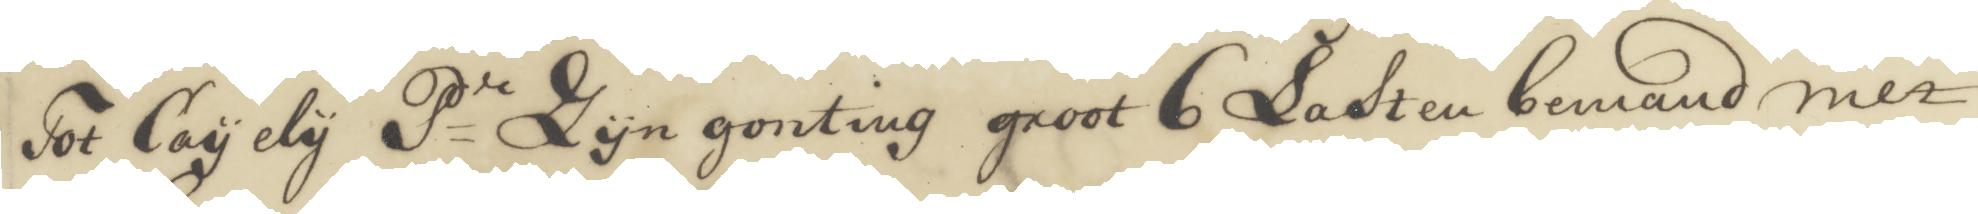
Tot Caij elij P=r zijn gonting groot 6 Lasten bemand met
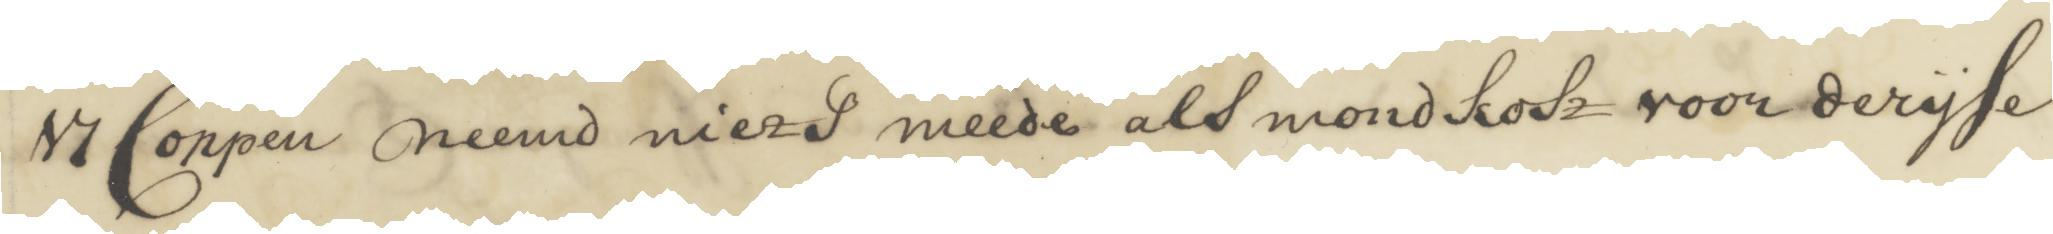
17 Coppen neemd niets meede als mond kost voor derijse
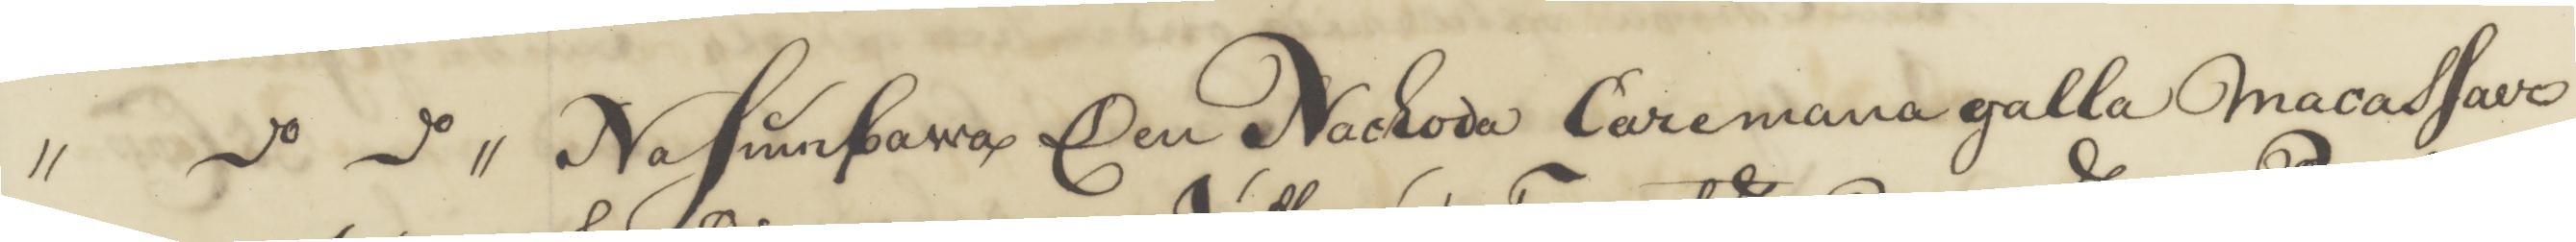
„ _o _o „ Na sumbawa Den Nachoda Caremana galla macassaer
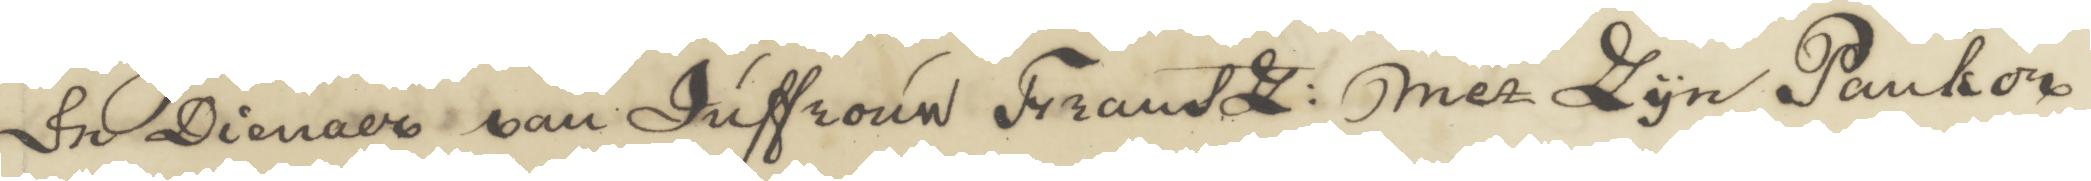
En Dienaer van Iuffrouw Fransz: met zijn Pankor
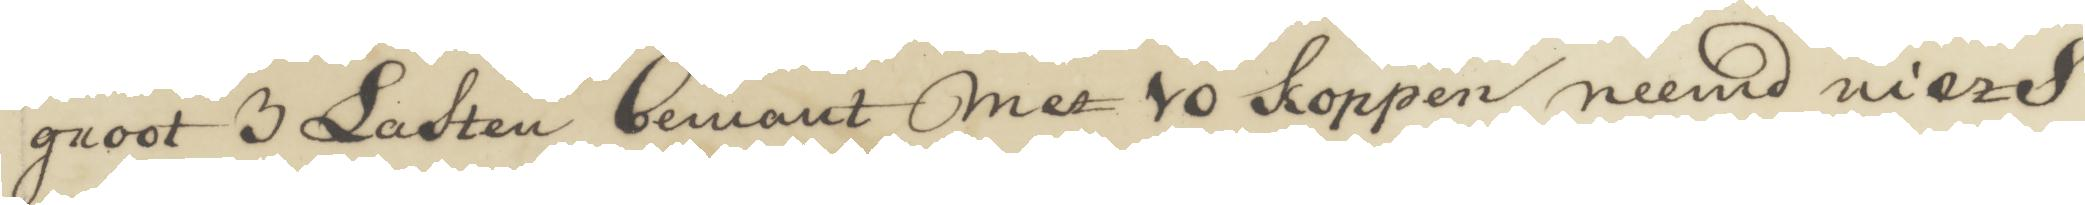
groot 3 Lasten bemant met 10 koppen neemd niets
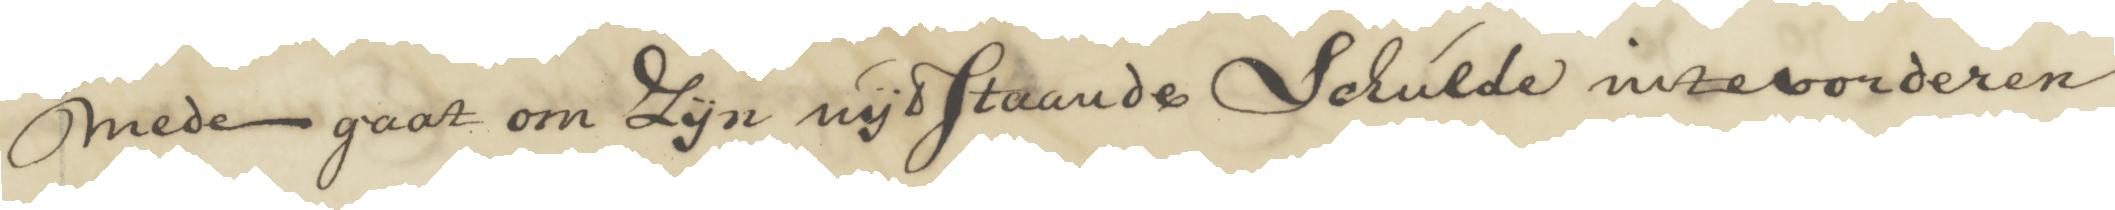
mede gaat om zijn uijtstaande schulde intevorderen
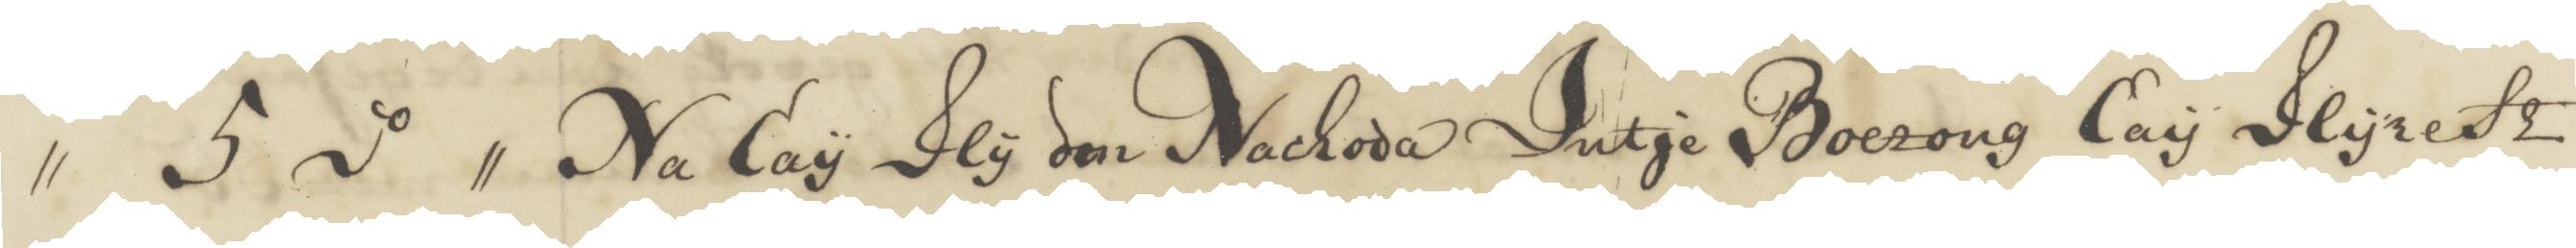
„ 5 _o „ Na Caij Elij den Nachoda Intje Boetong Caij Elijresz
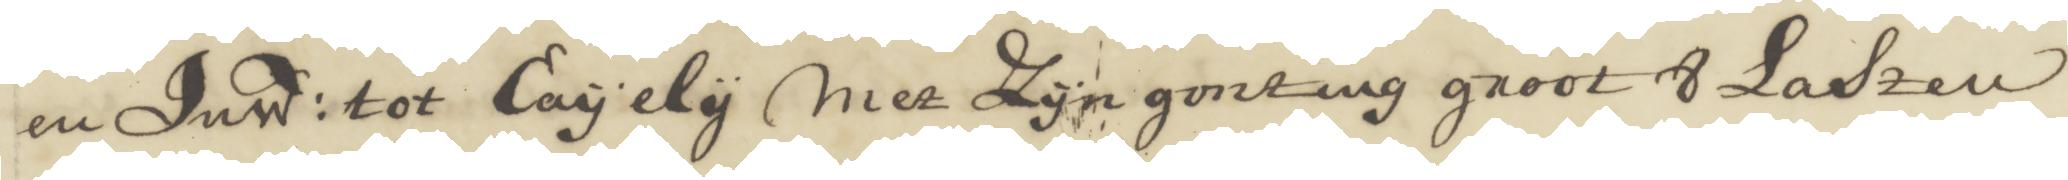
en Inw: tot Caij elij met zijn gonting groot 8 Lasten
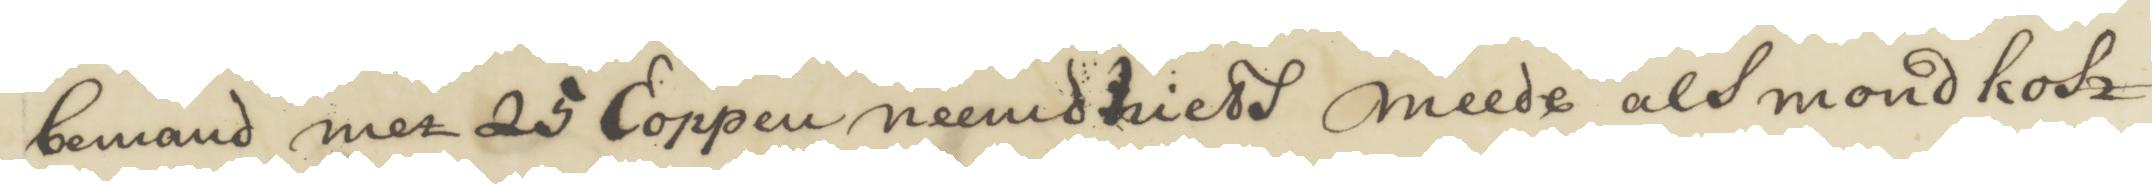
bemand met 25 Coppen neemd niets meede als mond kost
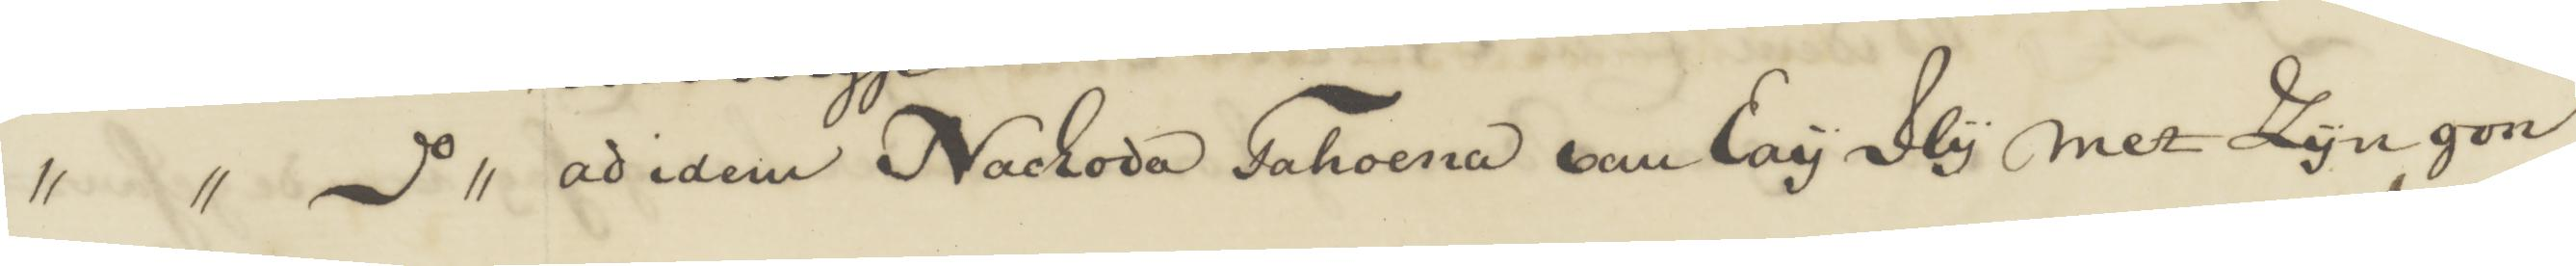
„ „ _o „ ad idem Nachoda Tahoena van Caij Elij met zijn gon
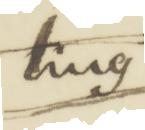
ting
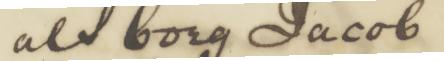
als borg Iacob
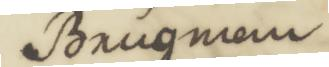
Brugman
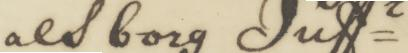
als borg Iuff=r
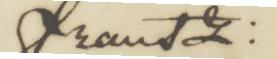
fransz:
